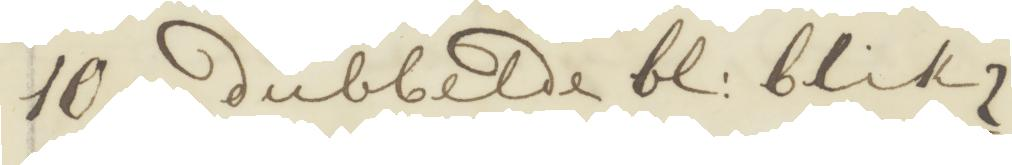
10 „ dubbelde bl: blik
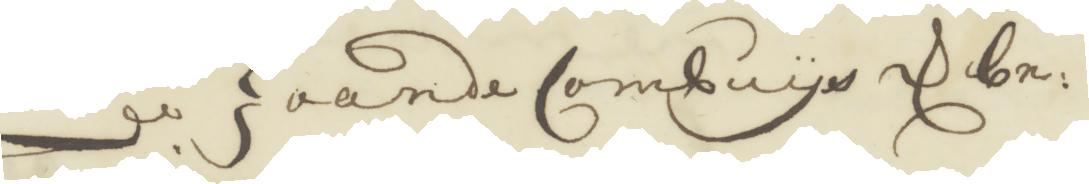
d:o aande Combuijs verbr:
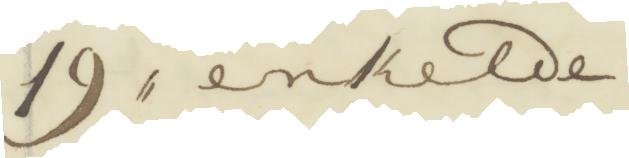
19 „ enkelde _„o
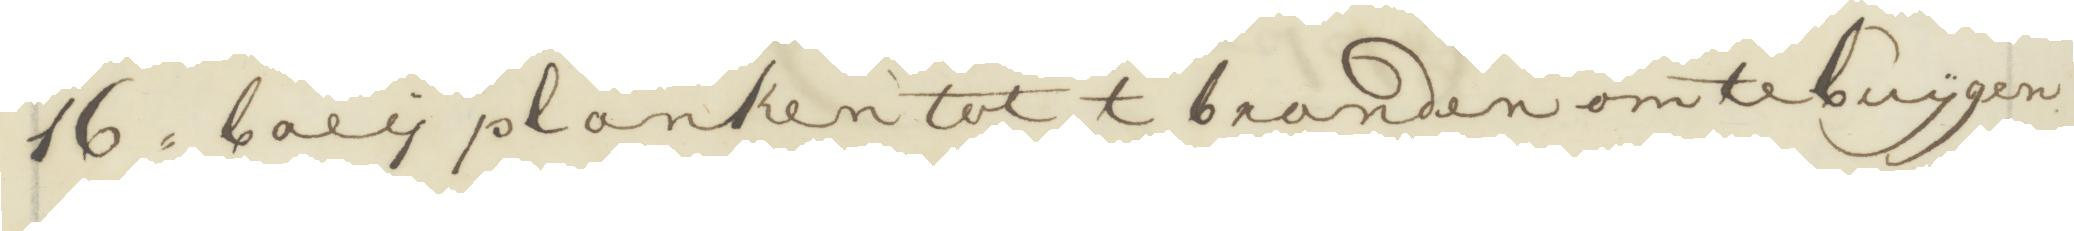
16 „ balij planken tot ’t branden om te buijgen
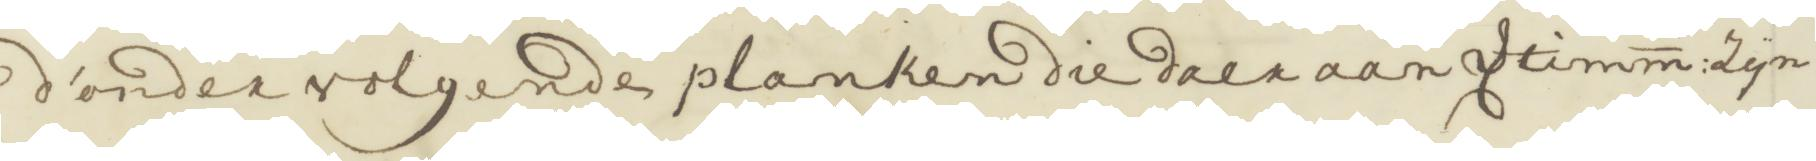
d’ onder volgende planken die daer aan vertimm: zijn
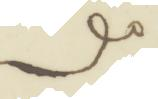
_ _ _ _ _ _ _„o
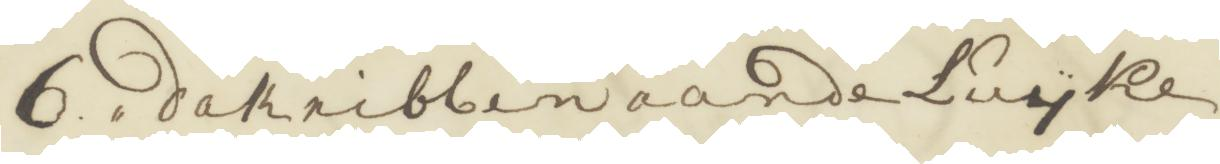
6. „ dakribben aande luijken
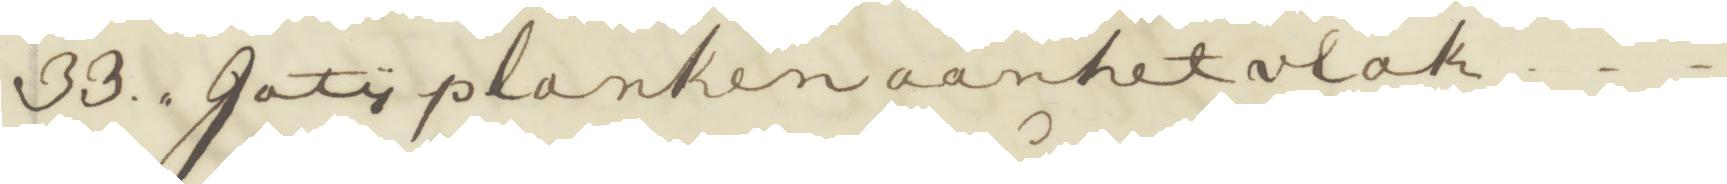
33.„ jatij planken aan het vlak. _ _ _ _
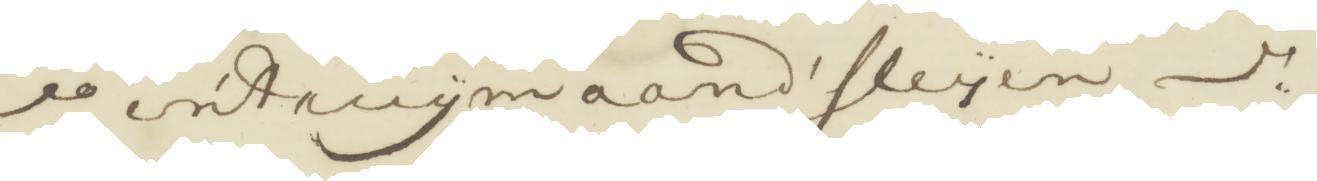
2.„ _„o in't ruijm aand' sleijen d„o
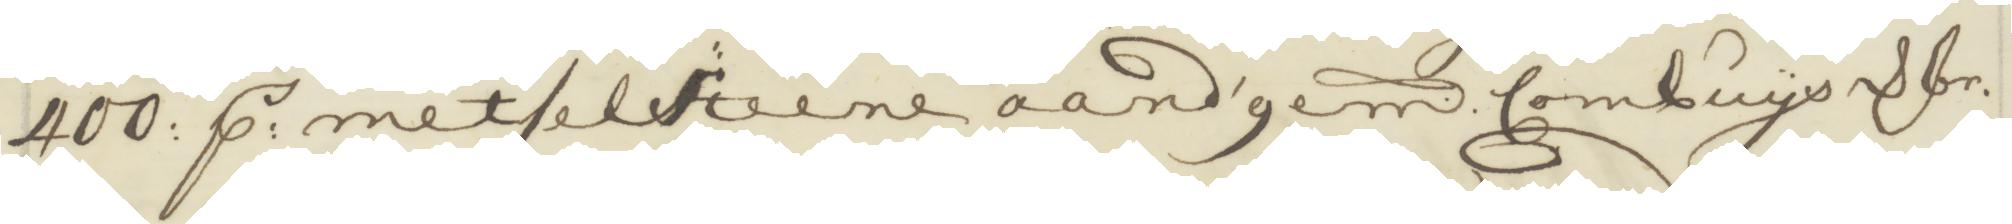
400: p:s metselsteene aand' gem: combuijs verbr.
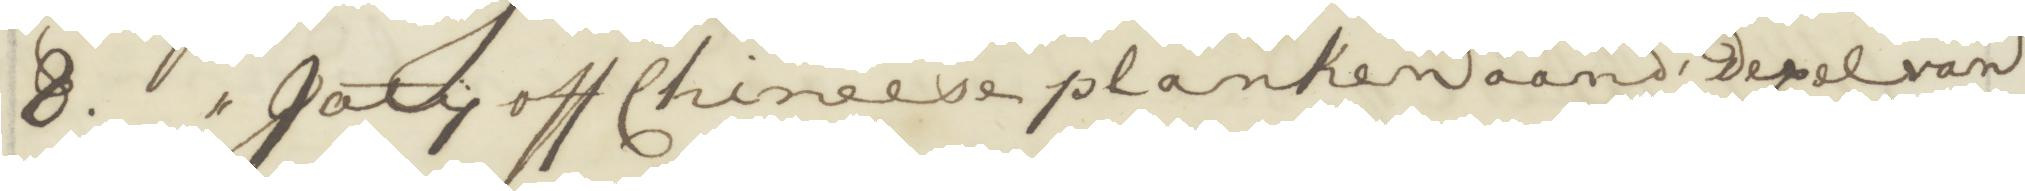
8. „ galij off chineese planken aand' dexel van
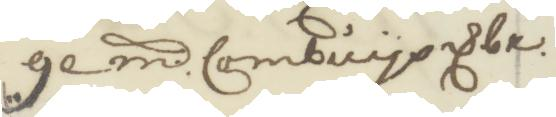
gem: combuijs verbr.
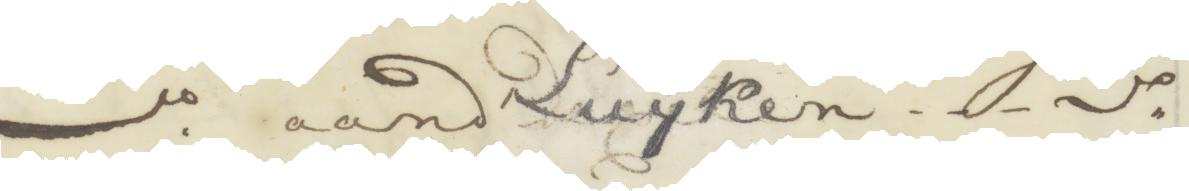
_.o aand luijken _ _ _ _„o
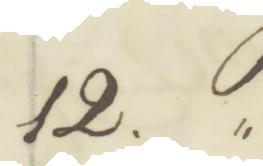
12. „
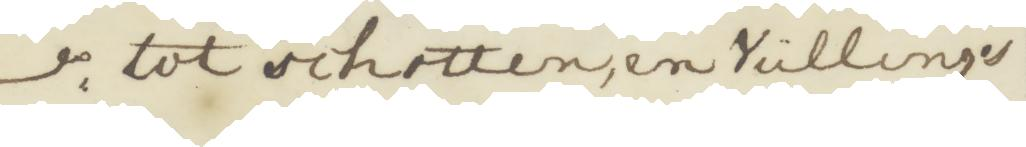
_„o tot schotten en vullings
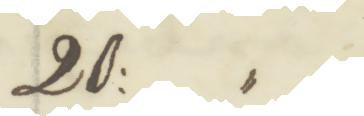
20: „ „ „
